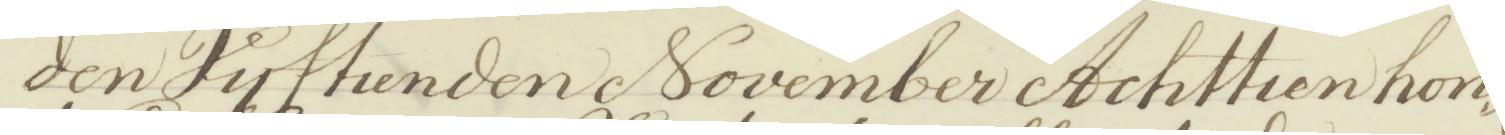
den Vyftienden November Achttien hon„
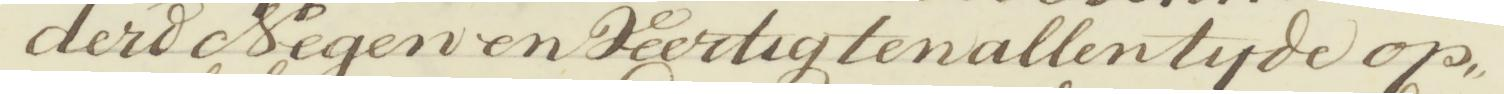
derd Negen en Veertig ten allen tyde op„
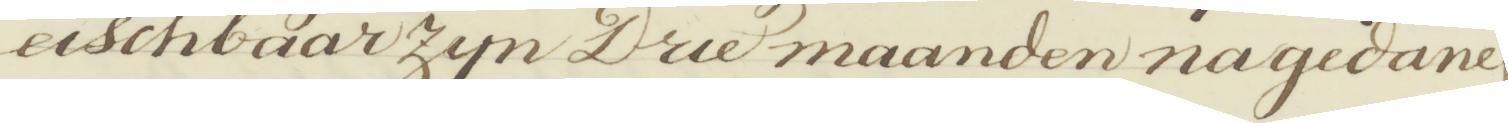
eischbaar zyn Drie maanden nagedane
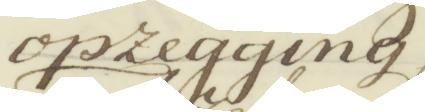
opzegging
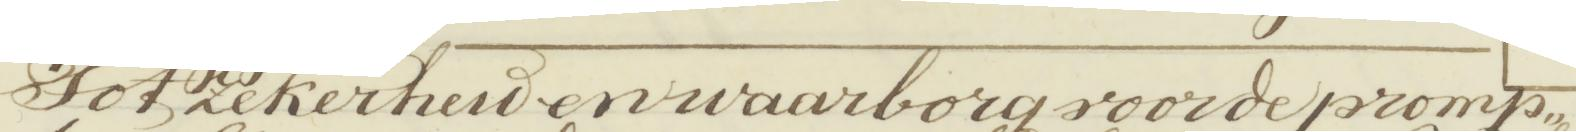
Tot zekerheid en waarborg voor de promp„
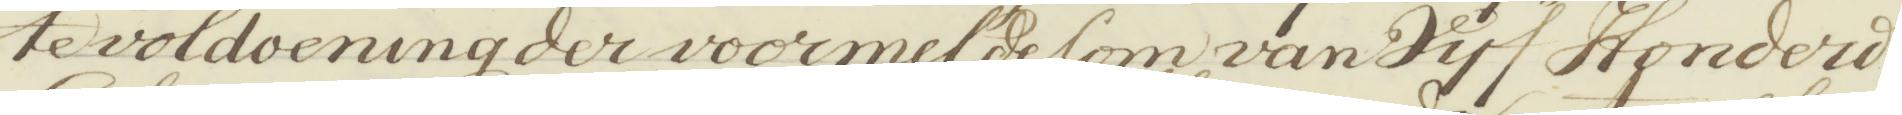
te voldoening der voormelde Som van Vyf Honderd
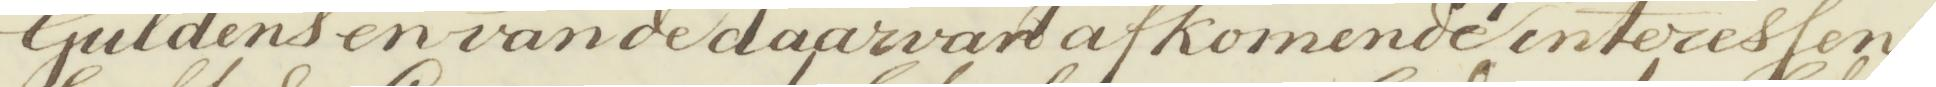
Guldens en van de daarvan afkomende interessen,
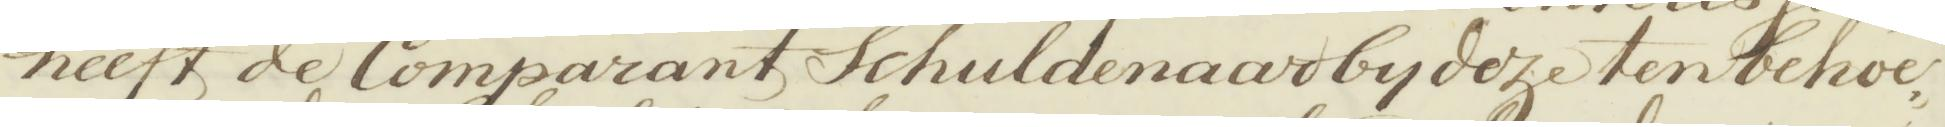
heeft de Comparant Schuldenaar by deze ten behoe„
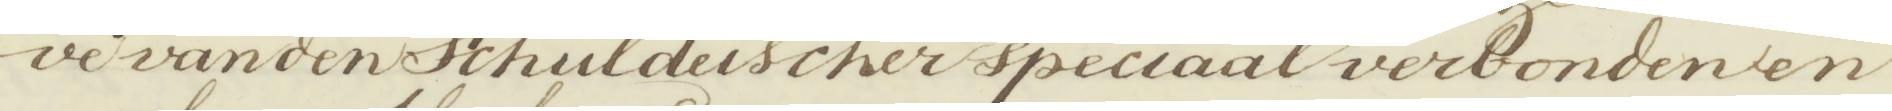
ve van den Schuldeischer Speciaal verbonden en
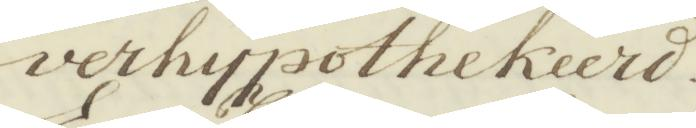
verhypothekeerd
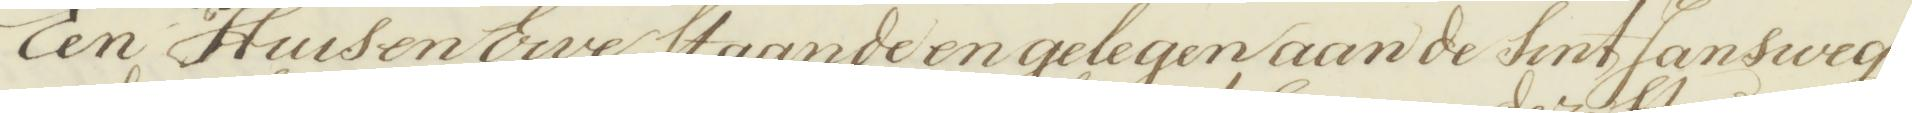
Een Huisen Erve, staande en gelegen aan de Sint Jansweg,
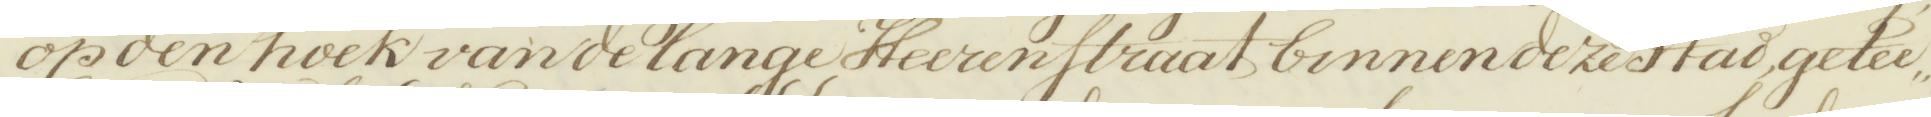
op den hoek van de lange Heerenstraat binnen deze Stad, getee„
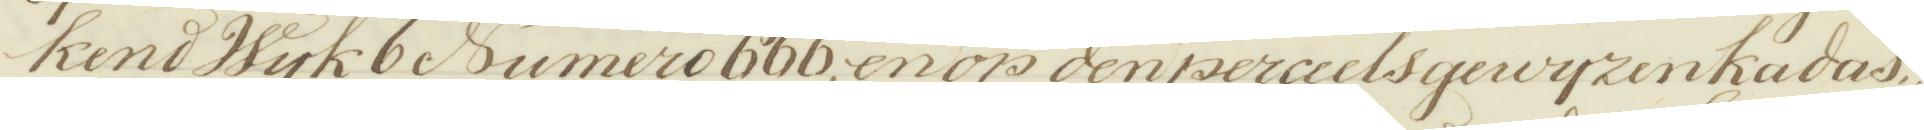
kend Wyk 6 Numero 666, en op den perceels gewyzen kadas.
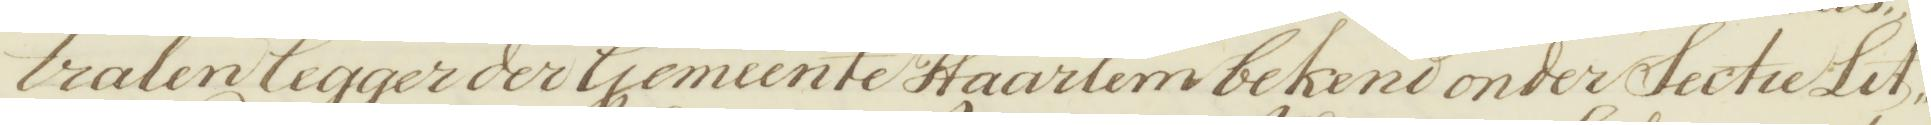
tralen legger der Gemeente Haarlem bekend onder Sectie Lit„
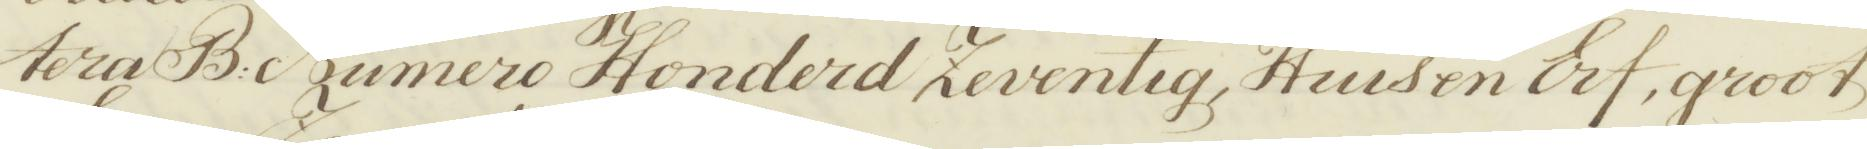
tera B: Numero Honderd Zeventig, Huis en Erf, groot
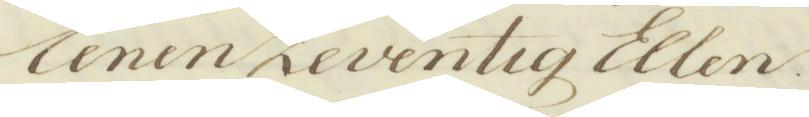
Eenen Zeventig Ellen.
